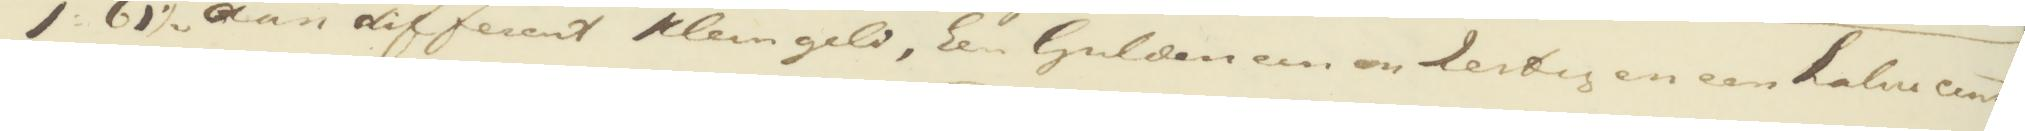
1: 61½ Aan different klein geld, Een Gulden een en Zestig en een halve cent
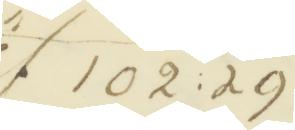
ƒ 102:29
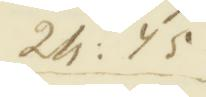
24: 75
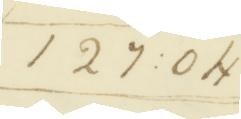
127:04
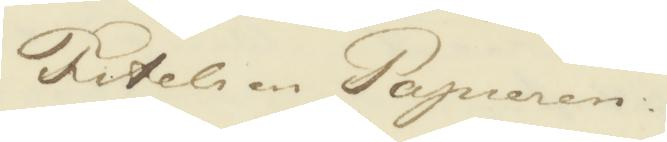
Titels en Papieren:
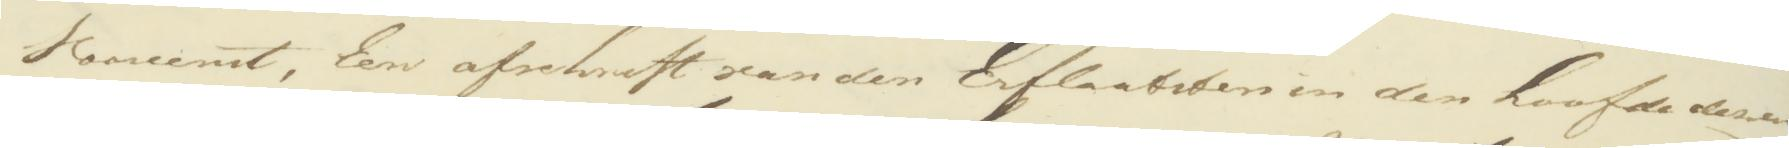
Vooeerst, Een afschrift van den Erflaatser in den hoofde deze
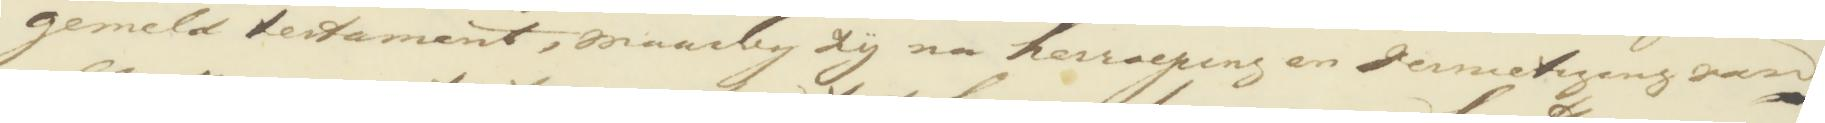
gemeld testament, waarby zij na herroeping en vernietiging van
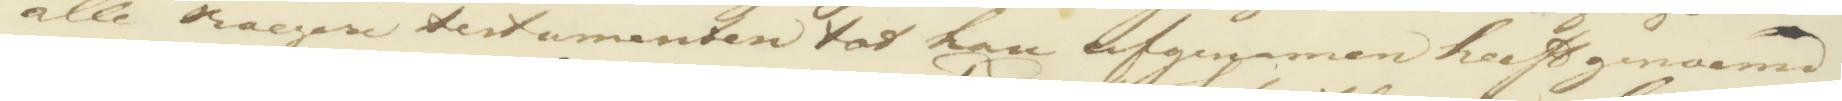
alle vroegere testamenten tot hare erfgenamen heeft genoemd
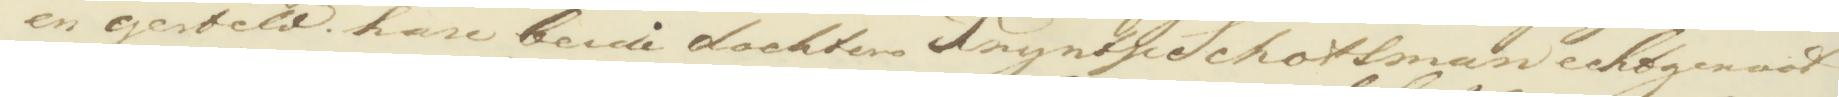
en gesteld. hare beide dochter Tryntje Schotsman echtgenoot
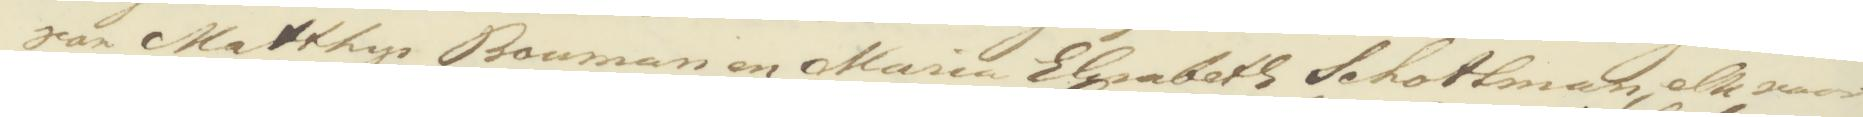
van Matthys Bouman en Maria Elisabeth Schottman, elk voor
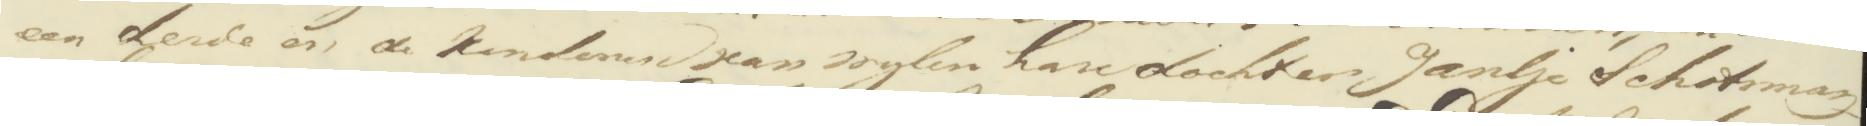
een derde en de kinderen van wylen hare dochter Jantje Schotsman
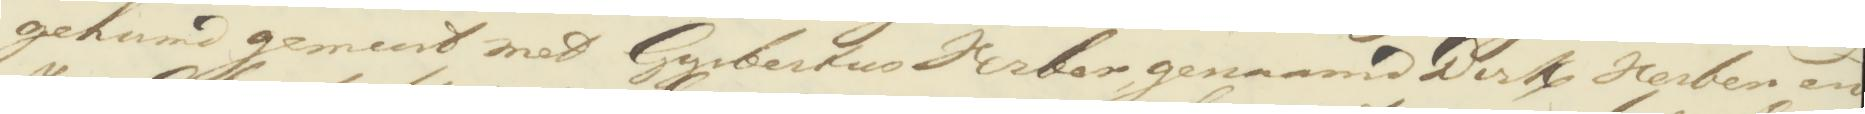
gehuwd geweest met Gysbertus Verber, genaamd Dirk Verber en
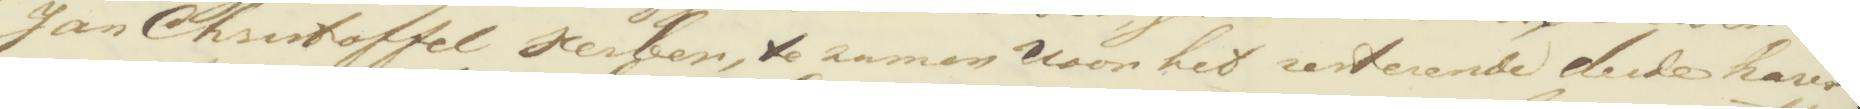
Jan Christoffel Verber, te zamen voor het resterende derde haren
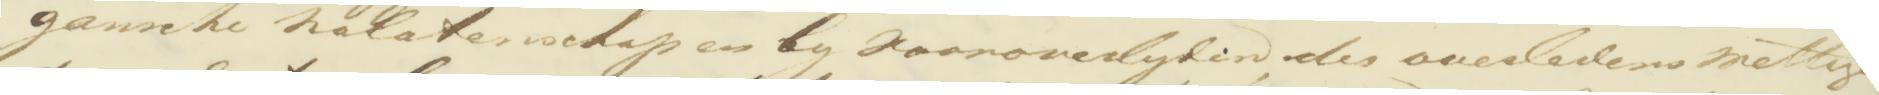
gansche nalatenschap en by vooroverlyden des overledens wettige
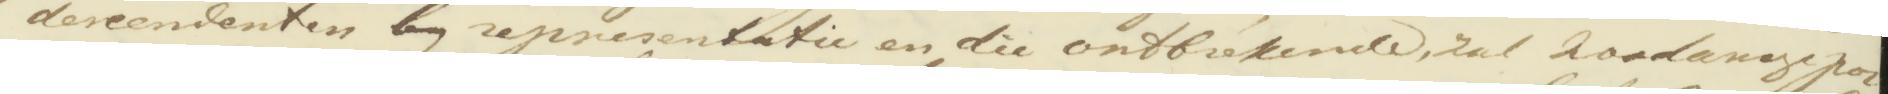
descendenten by representatie en die ontbrekende, zal zoodanige por
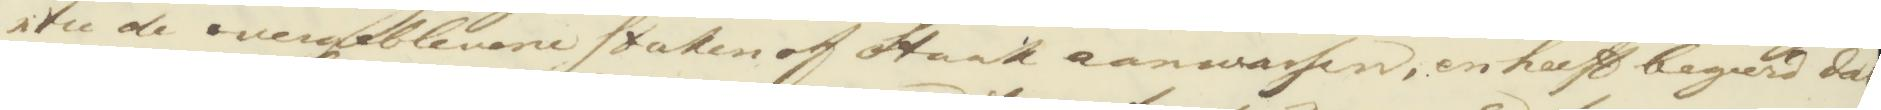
tie de overgeblevene staken of staak aanwassen, en heeft begeerd dat
